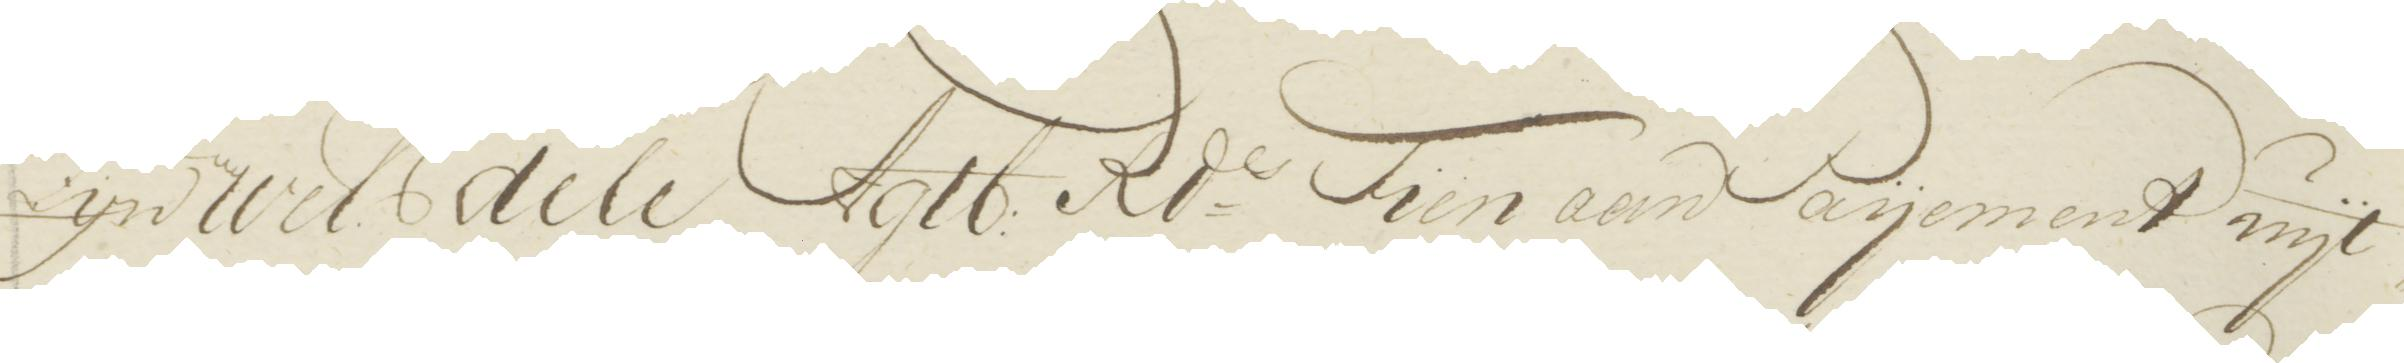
zijn Wel Edele Agtb: Rd=s Tien aan Paijement uijt
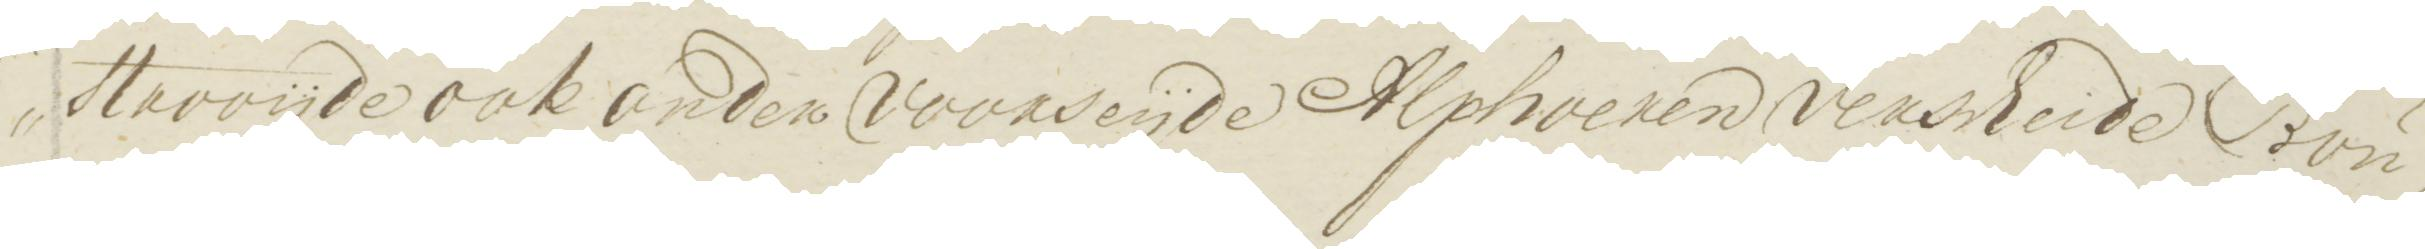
„strooijde ook onder voorseijde Alphoeren verscheide Bou
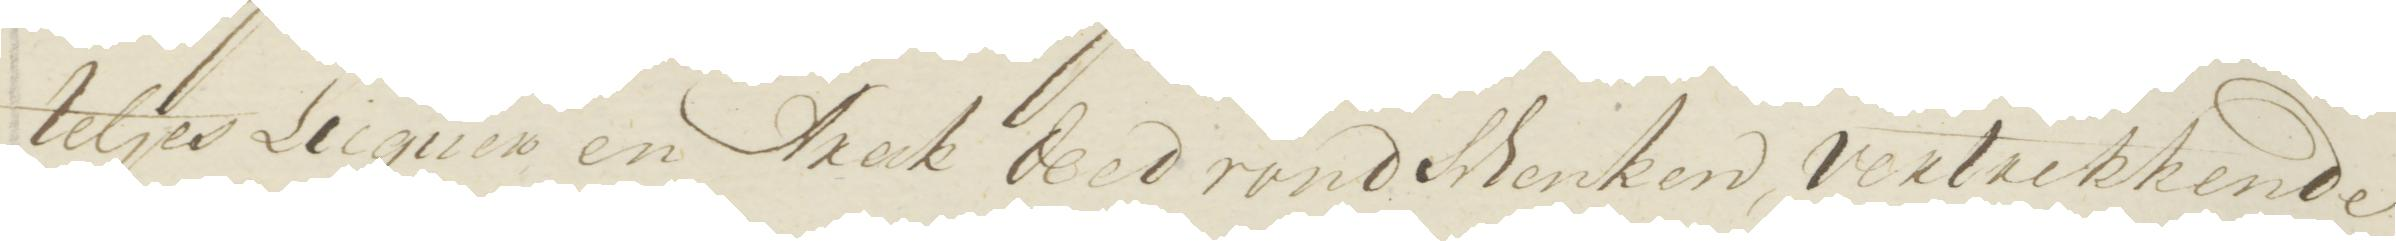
teljes Licquer en Arak deed rond schenken, vertrekkende
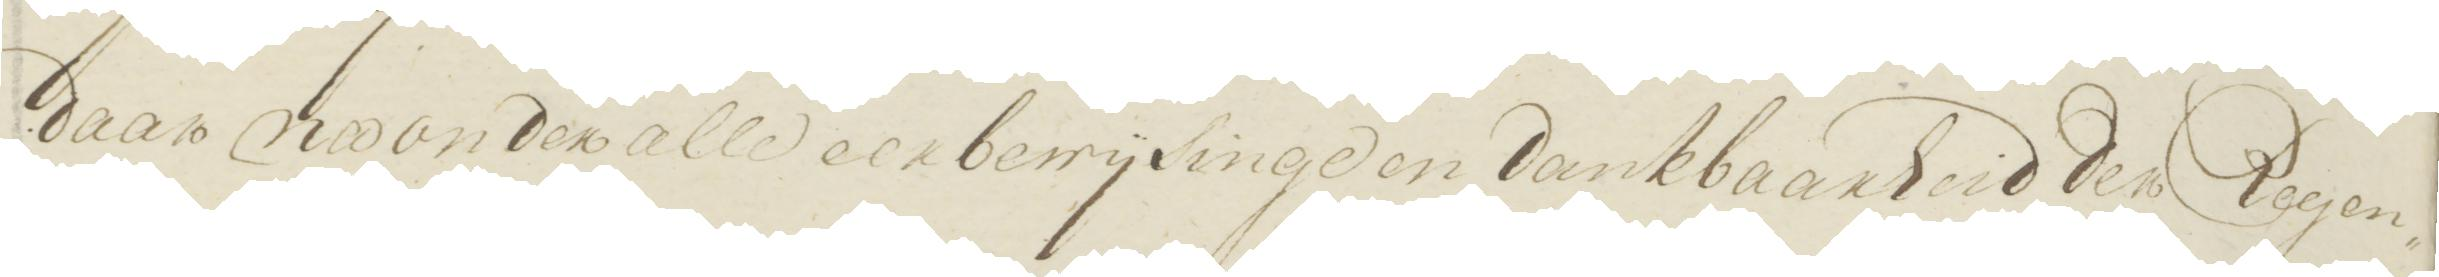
daar na onder alle eer bewijsinge en dankbaarheid den Regen„
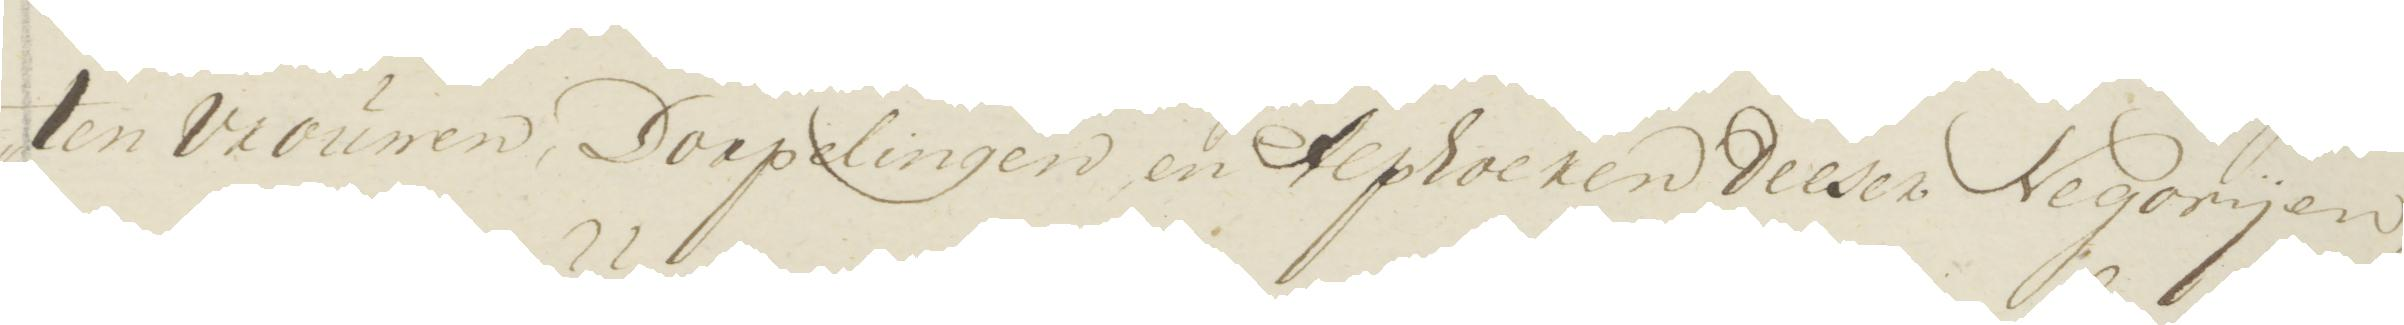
ten vrouwen, Dorpelingen, en Alphoeren deeser Negorijen
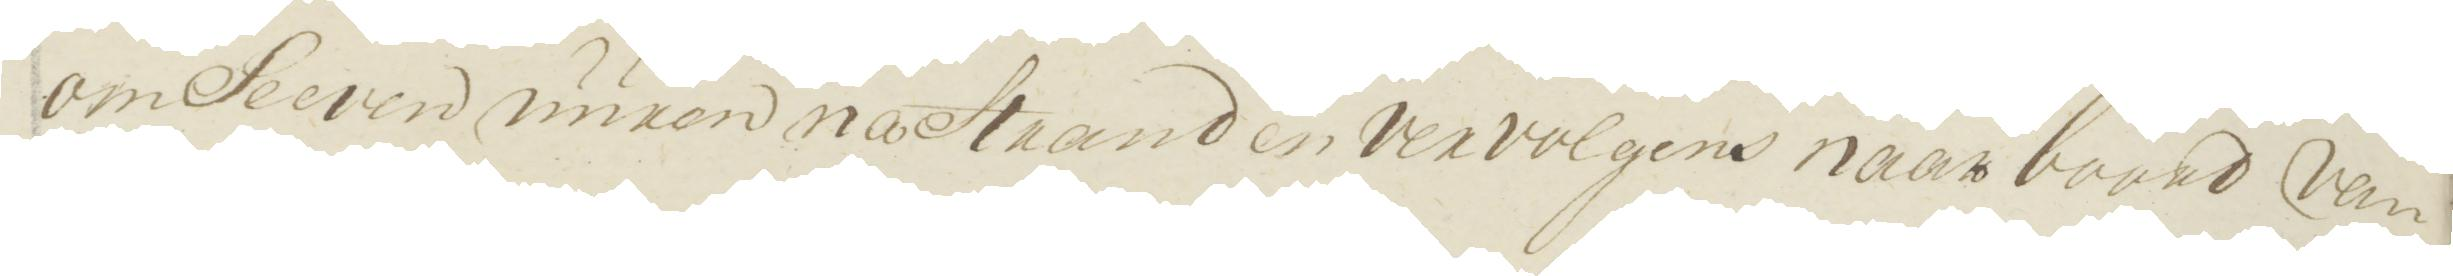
om seeven uuren na strand en vervolgens naar boord van
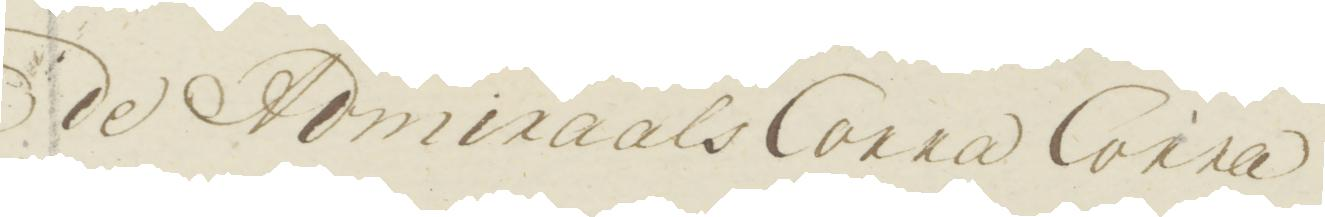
de Admiraals Corra Corra
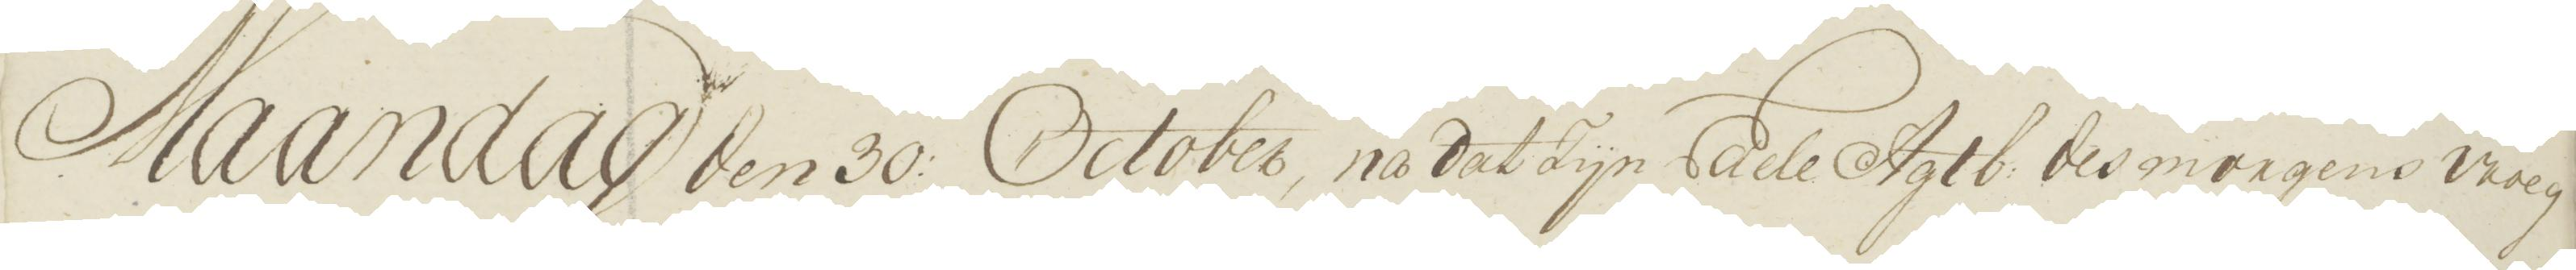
Maandag den 30: October, na dat zijn Edele Agtb: des morgens vroeg
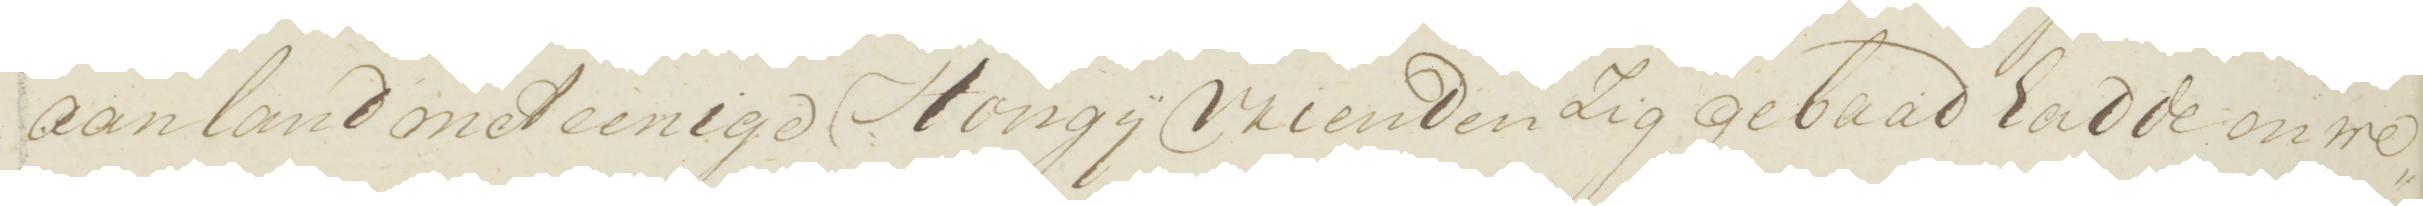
aan land met eenige Hongij vrienden zig gebaad hadde en we
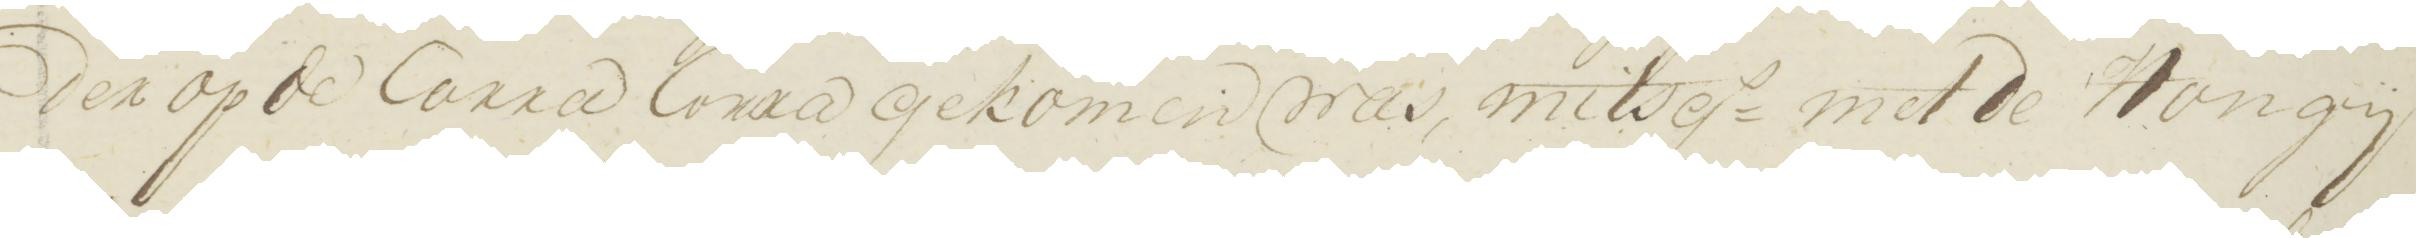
der op de Corra Corra gekomen was, mitsg=s met de Hongij
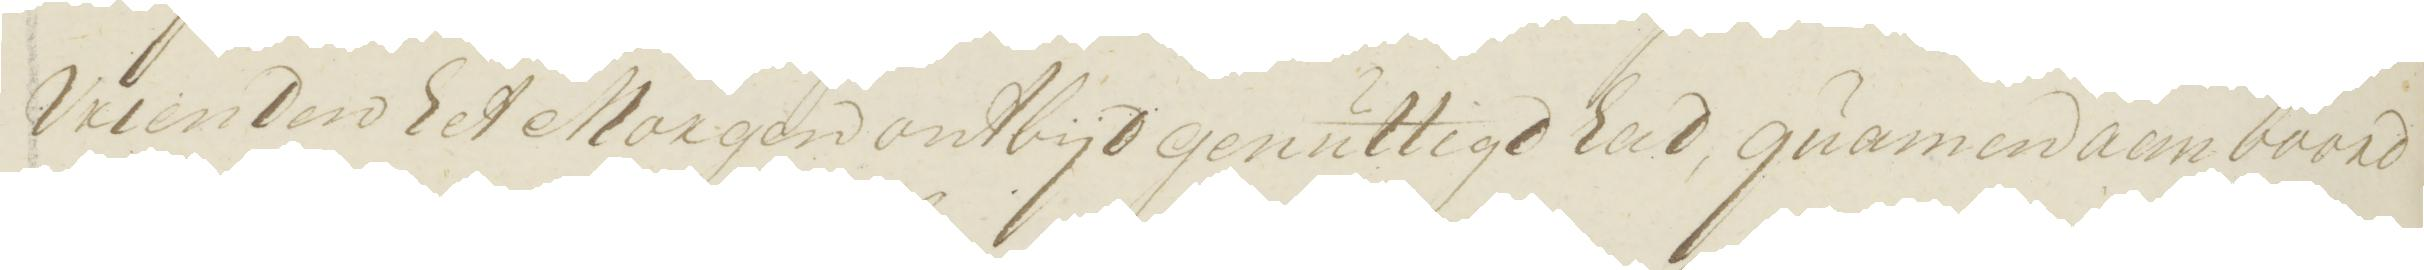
vrienden het Morgen ontbijd genuttigd had, quamen aan boord
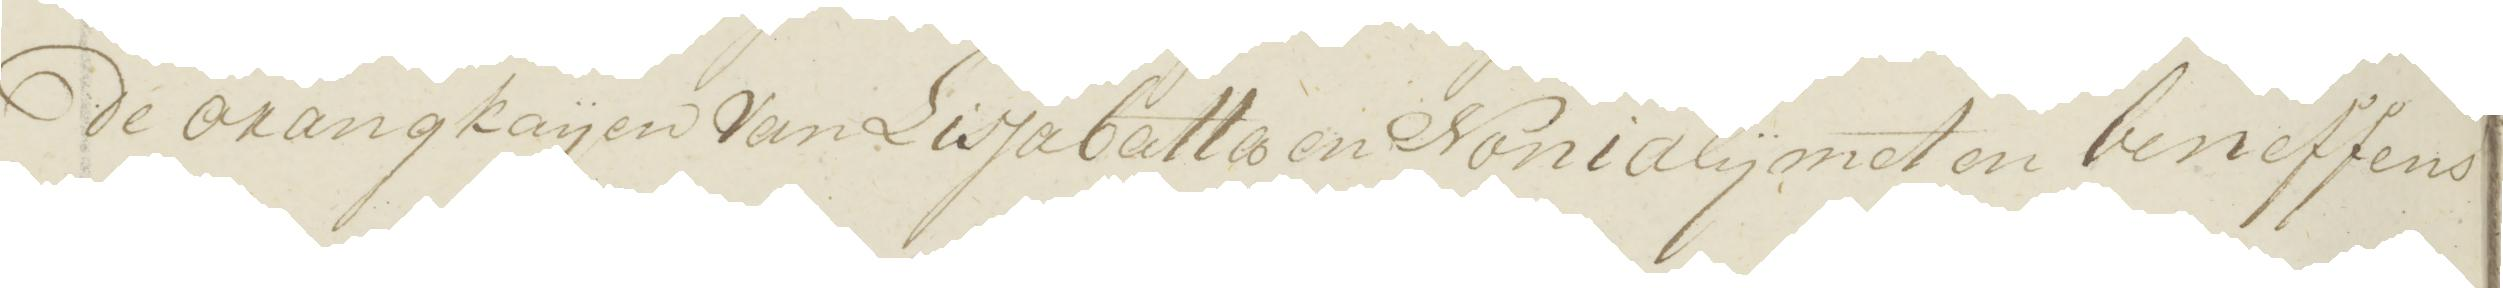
de orangkaijen van Lisjabatta en Nonialij met en beneffens
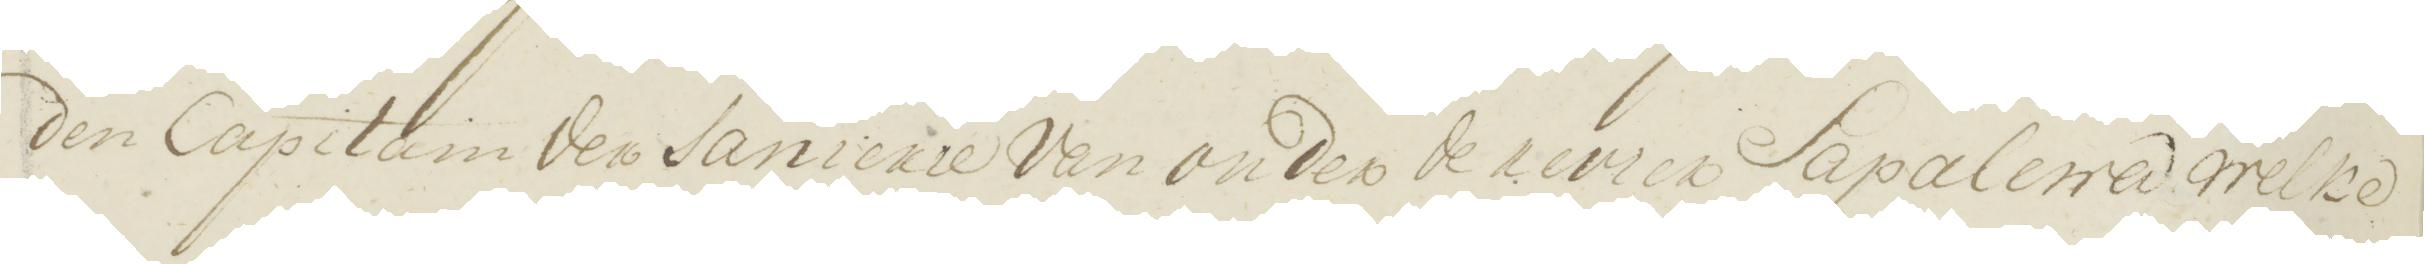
den Capitain der sanierie van onder de revier Sapalewa welke
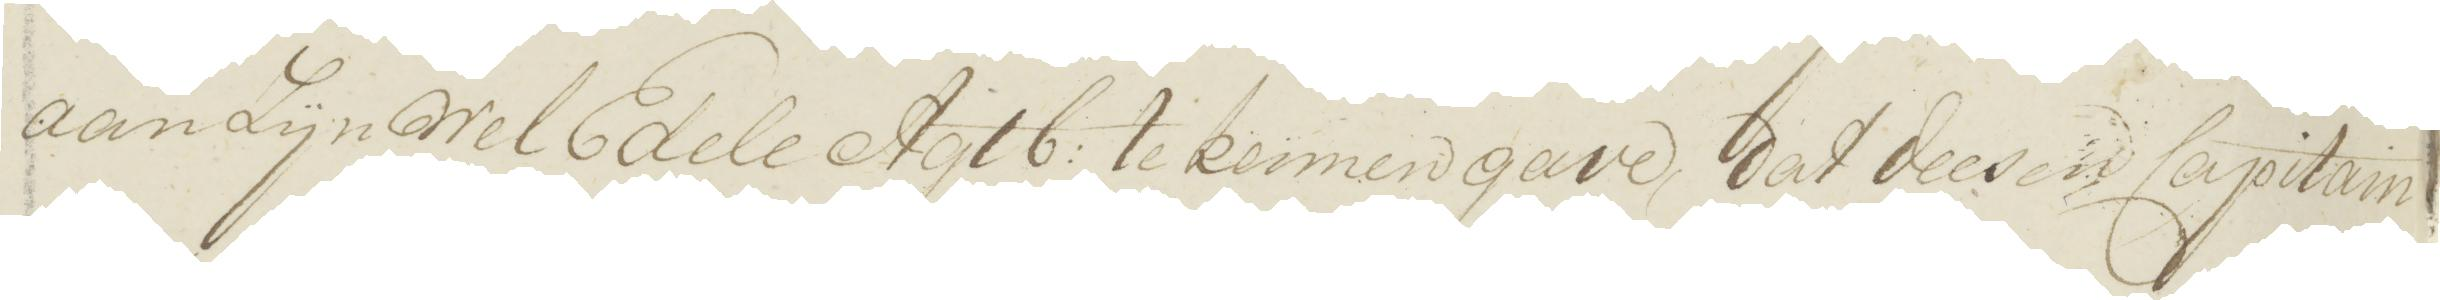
aan zijn wel Edele Agtb: te kennen gave, dat deesen Capitain
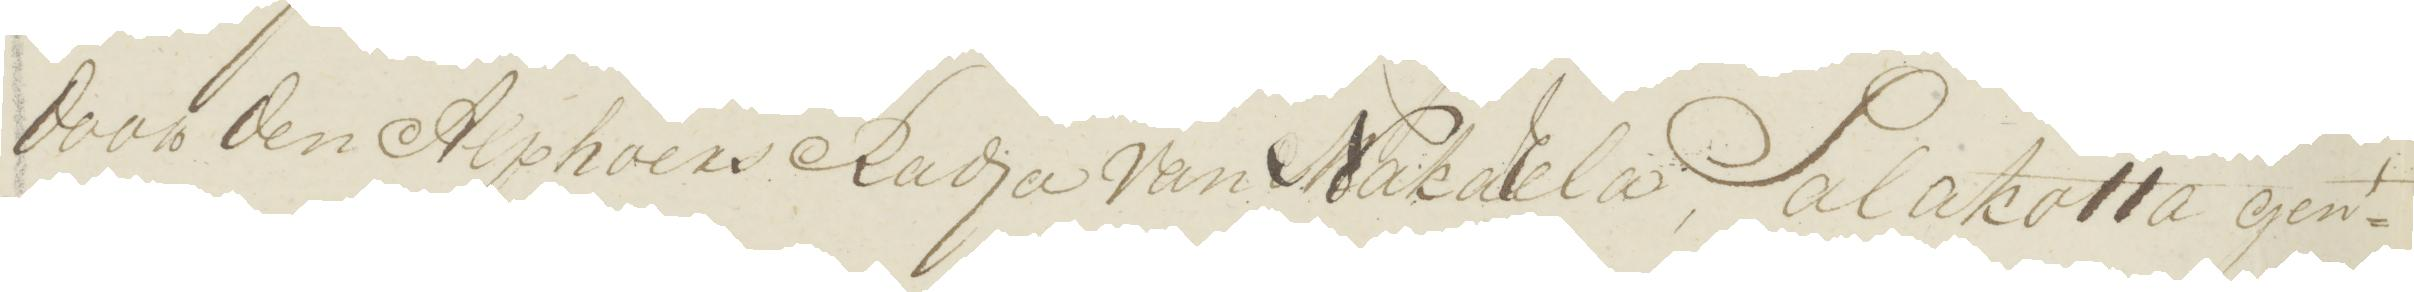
door den Alphoers Radja van Makahela, Salakotta gen=t
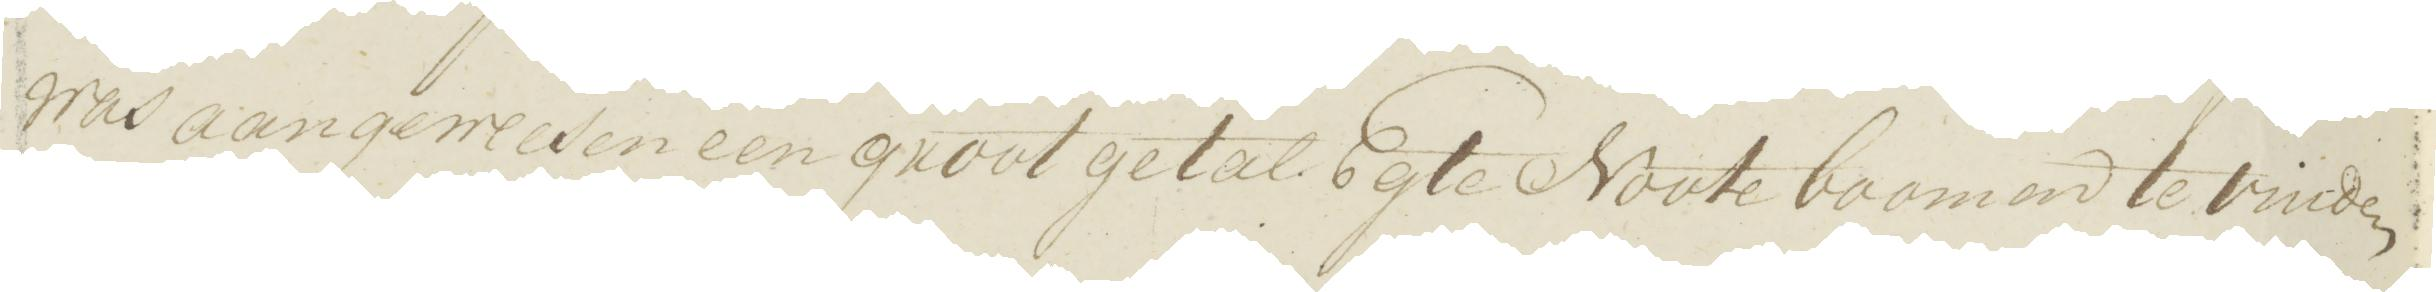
was aangeweesen een groot getal Egte Noote boomen te vinden
